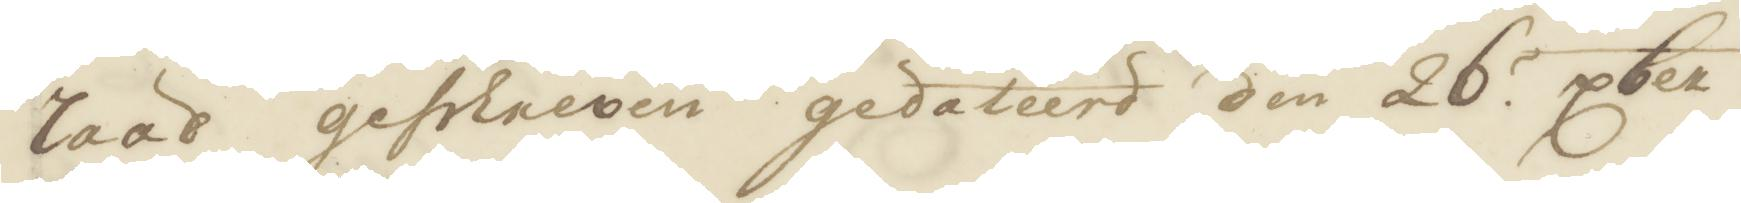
Raad geschreven gedateerd den 26:' xber
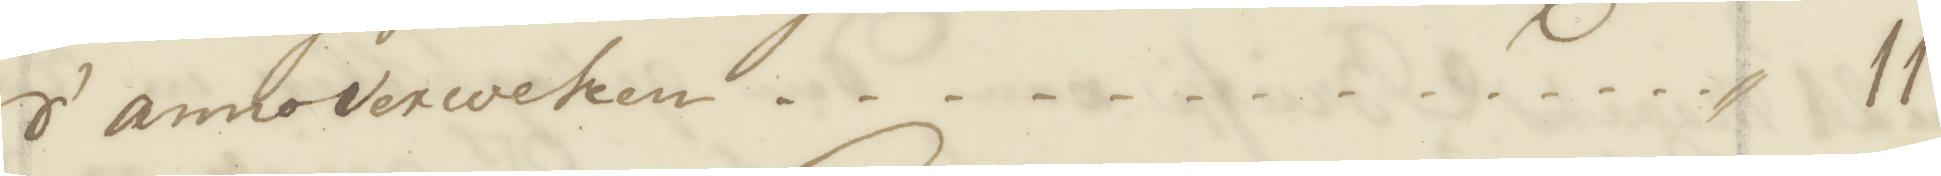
d’ anno verweken - - - - - - - - - - - - - - „ 11
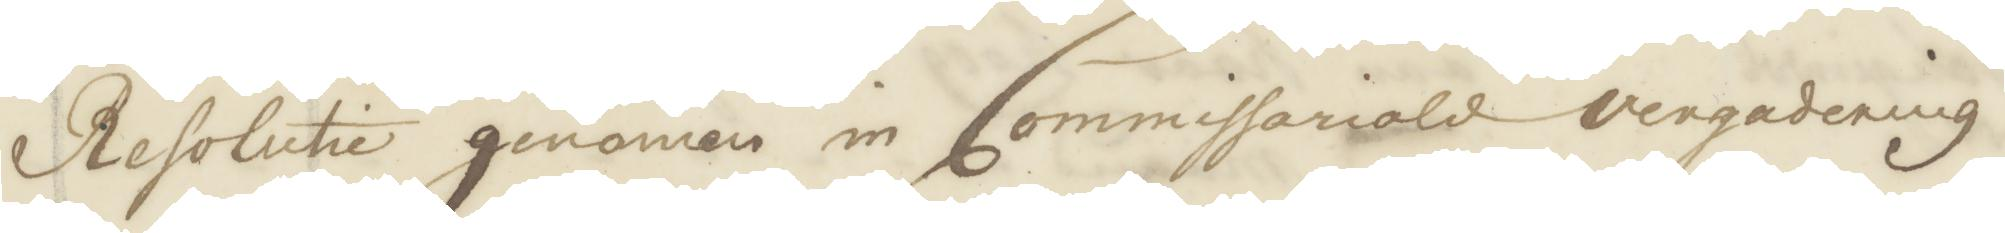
Resolutie genomen in Commissariale vergadering
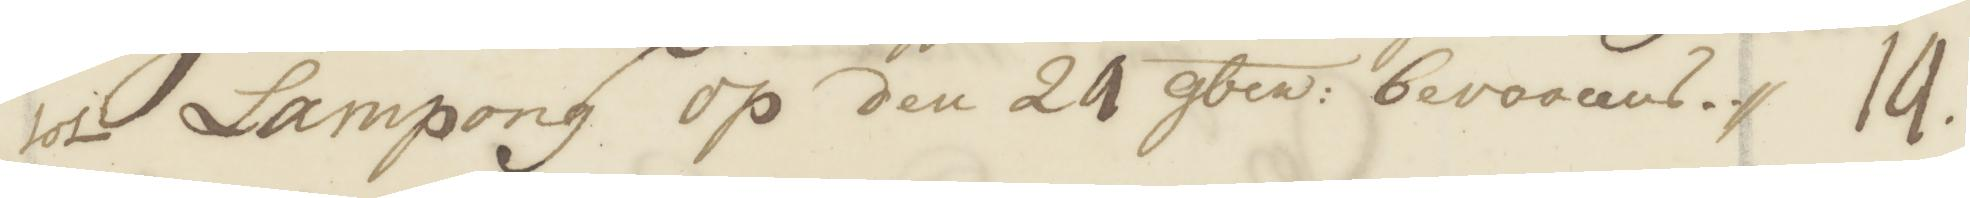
tot Lampong op den 24 9ber: bevoorens - - „ 14.
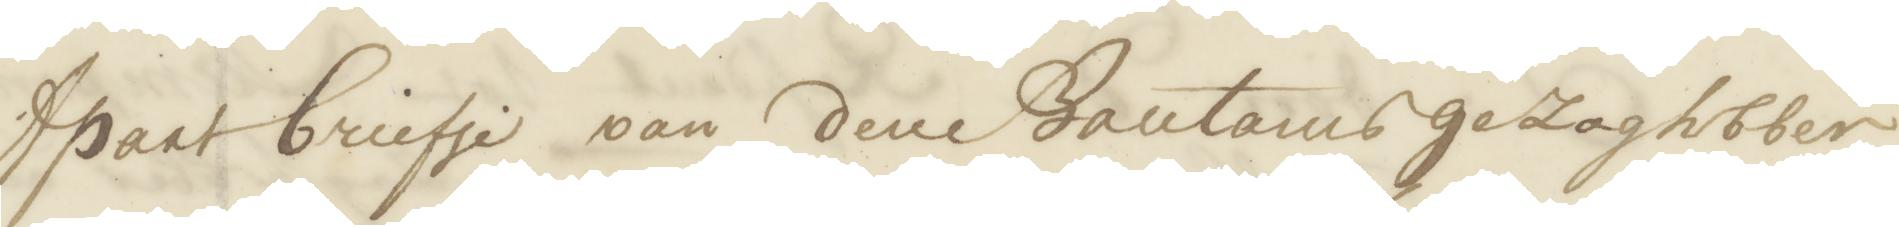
Apart briefje van deze Bantams gezaghebber
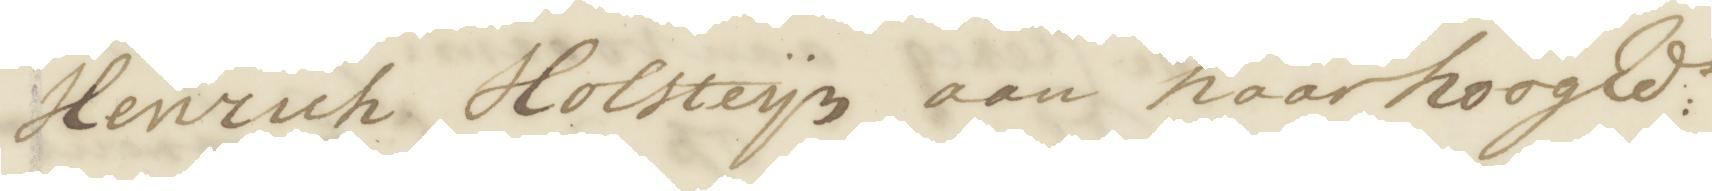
Henrich Holsteijn aan haar hoog Ed:
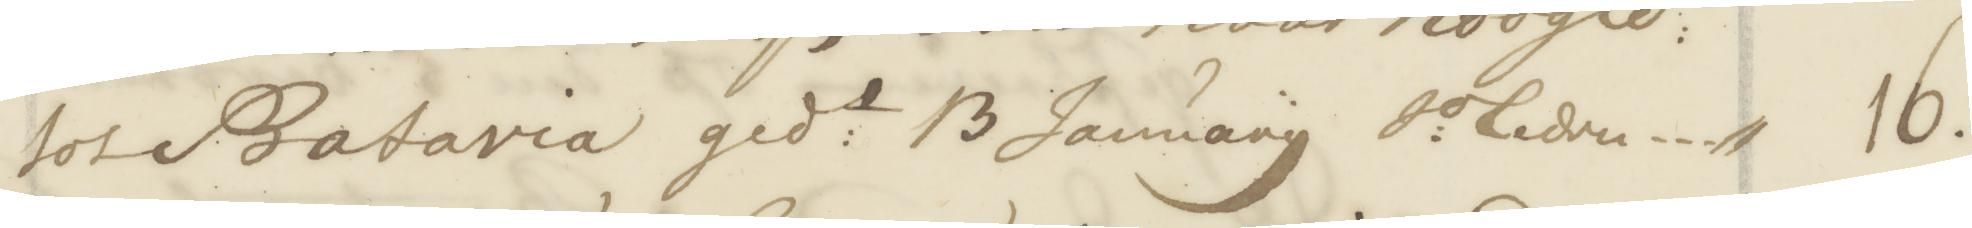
tot Batavia ged:t 13 Januarij d:o leden - - - „ 16
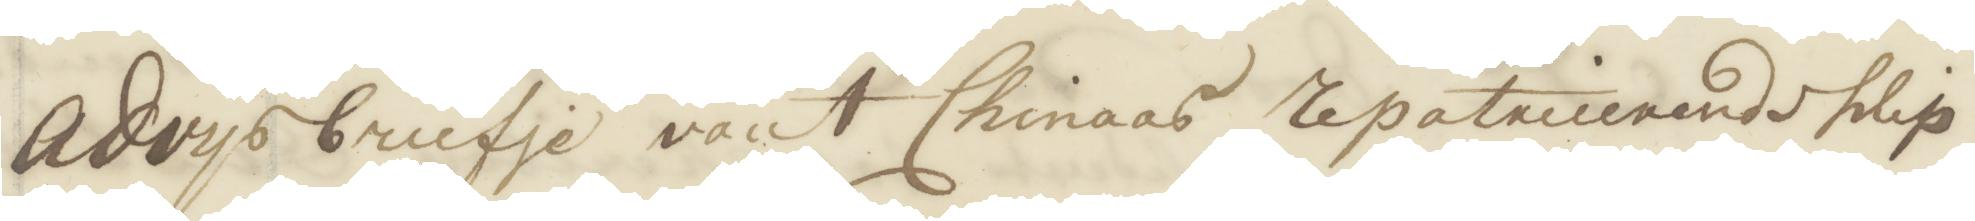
Advijs briefje van ’t Chinaas repatrieerende schip
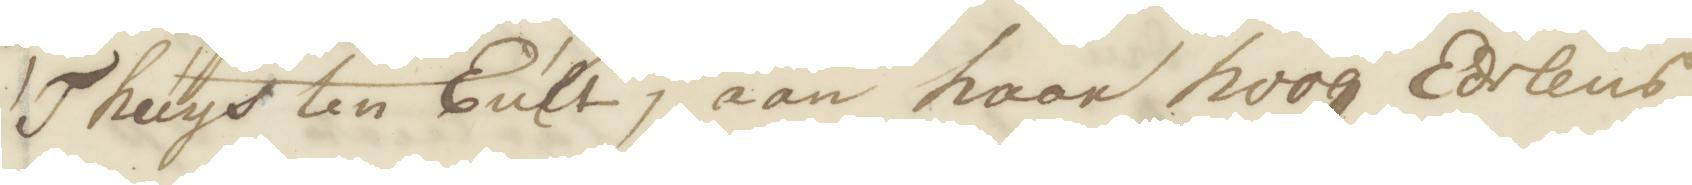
'T huys ten Eult, aan haar hoog Edelens
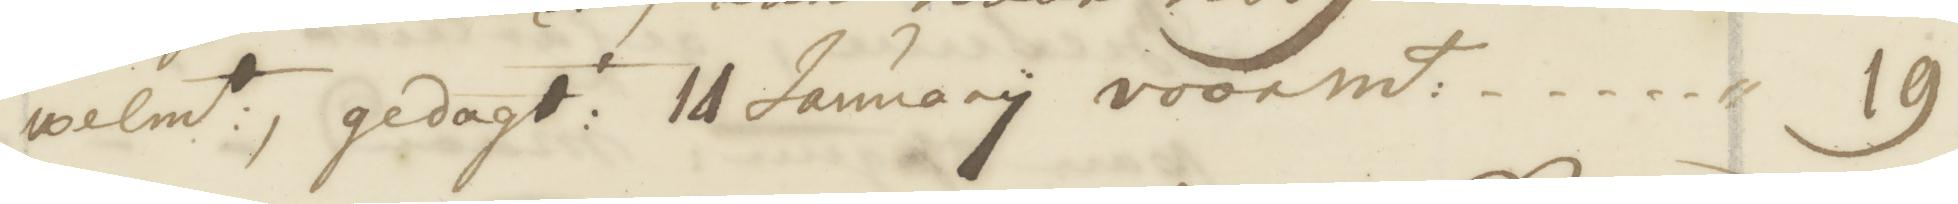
welm:t, gedagt:t 14 Ianuarij voorm:t - - - - - „ 19
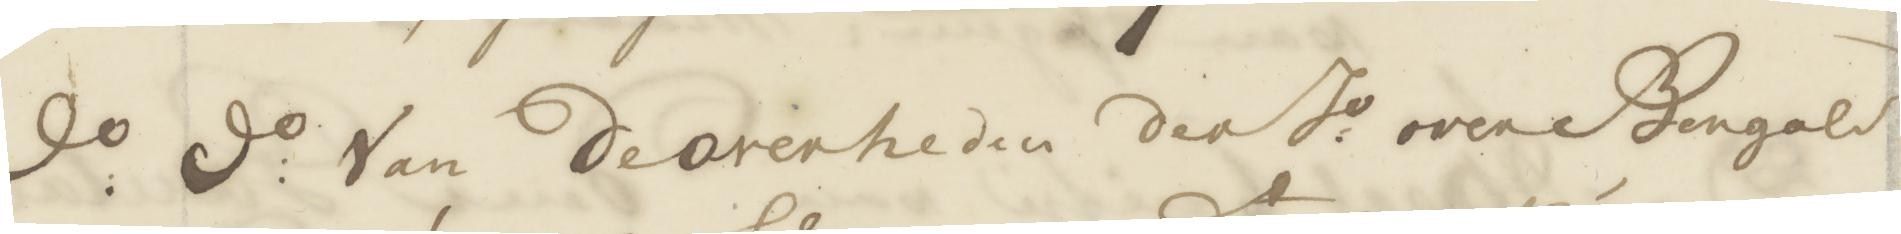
D:o D:o Van de overheden der J:o over Bengale
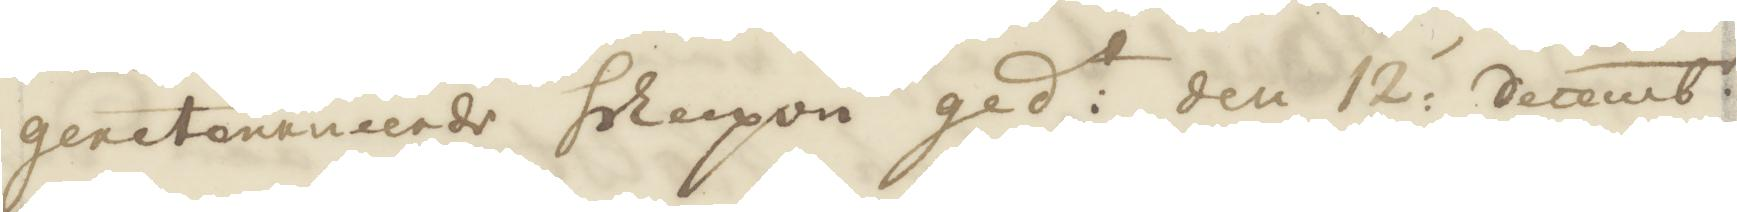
geretourneerde scheepen ged:t den 12:' decemb
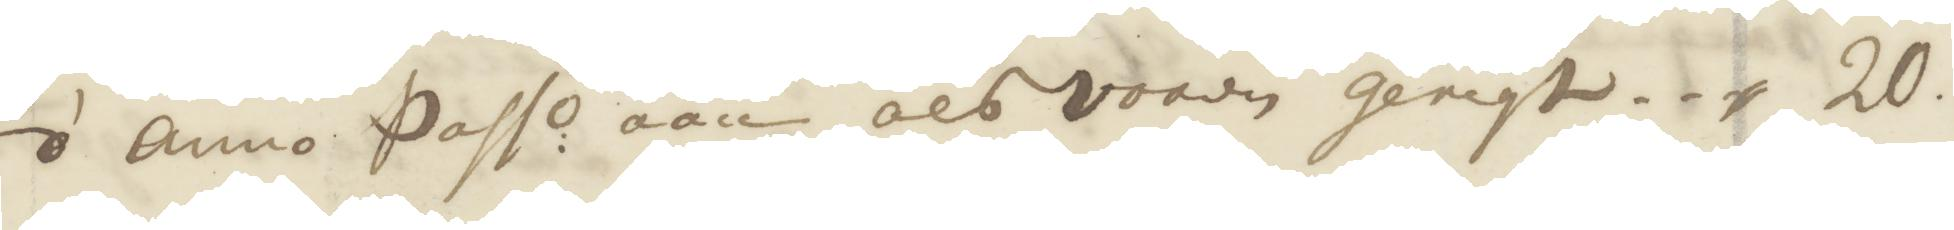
d’ Anno Pass:o aan als vooen gerigt - - „ 20.
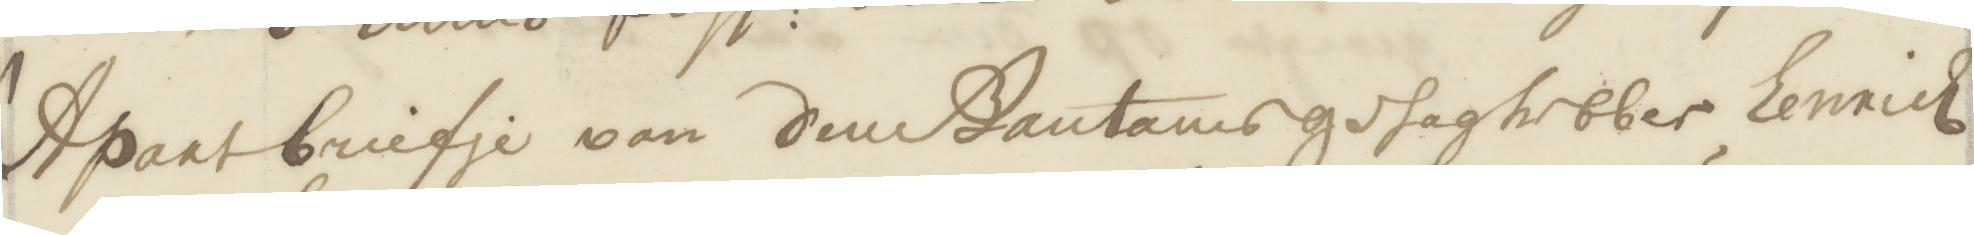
Apart briefje van den Bantams gesaghebber henrich
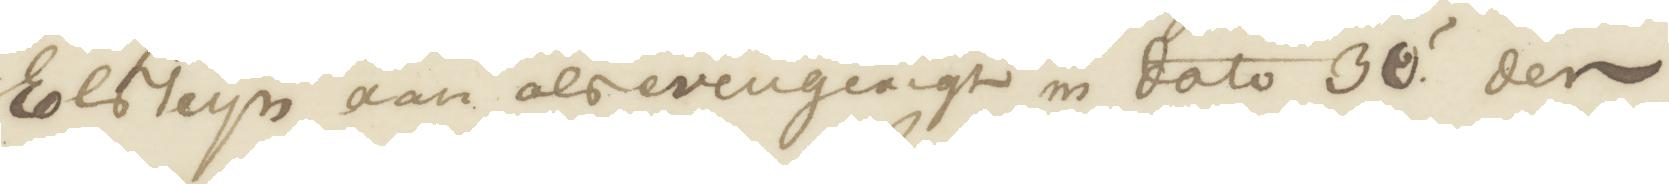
holsteijn aan als evengerigt in dato 30.' der
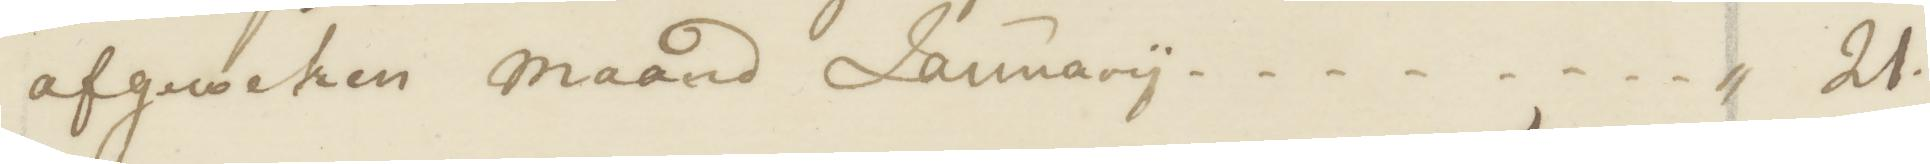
afgeweken maand Ianuarij - - - - - - - - „ 21
